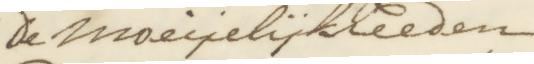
de moeijelijkheeden
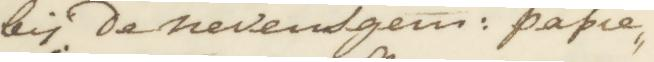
bij de nevensgem: papie„
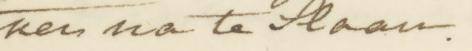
ren na te slaan.
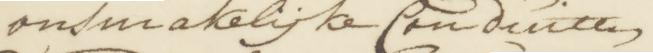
onsmakelijke Conduitten
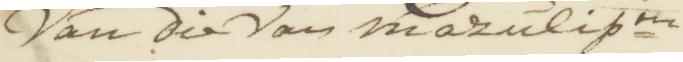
van die van mazulip=m
